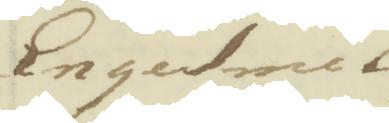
Engesmit
